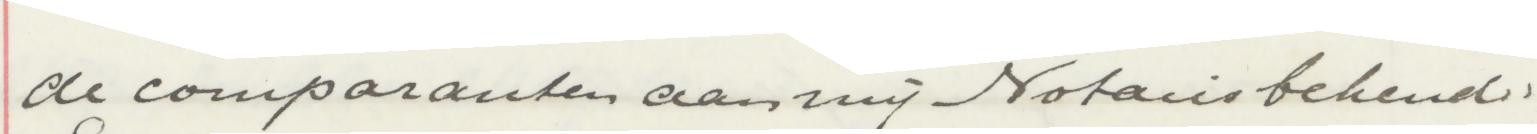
de comparanten aan mij Notaris bekend.
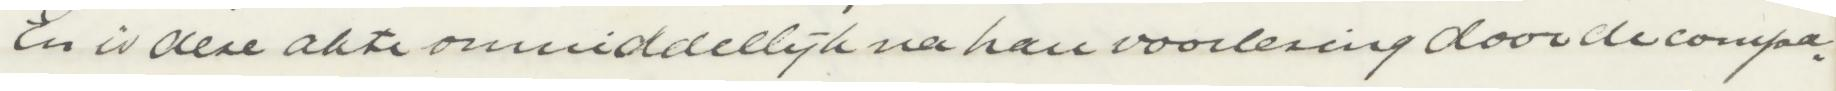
En is deze akte onmiddellijk na han voorlezing door de compa„
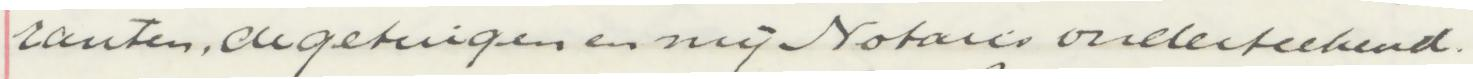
ranten, de getuigen en mij Notaris onderteekend.
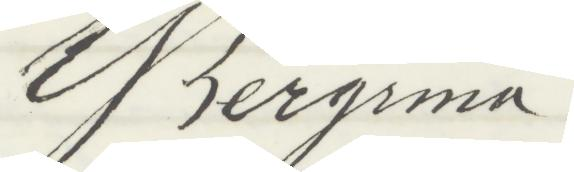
Bergsma
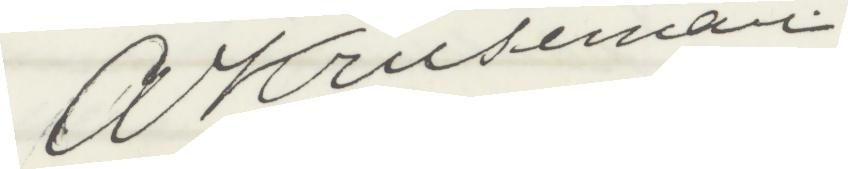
AKruseman
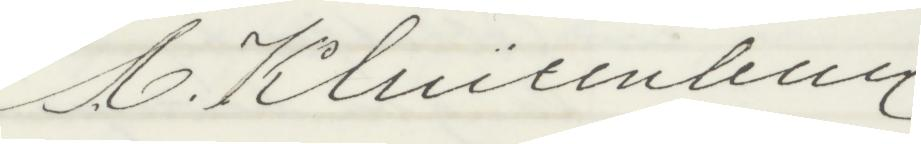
B. Kluitenberg
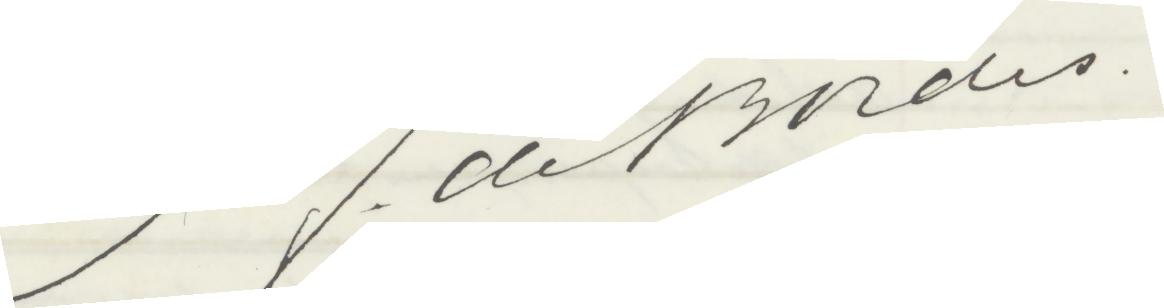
P. f. de Bordes
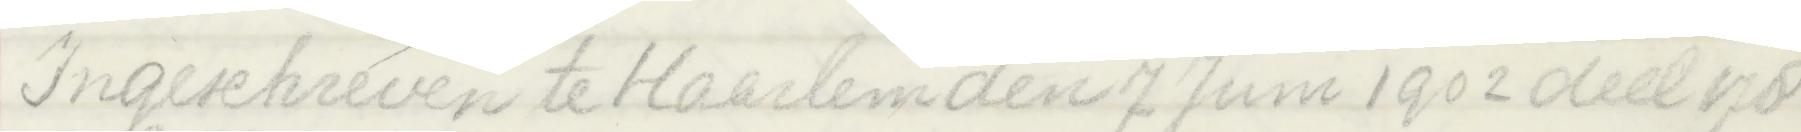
Ingeschreven te Haarlem den 7 Juni 1902 deel 178
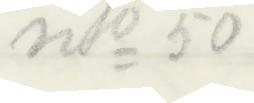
n=o 50
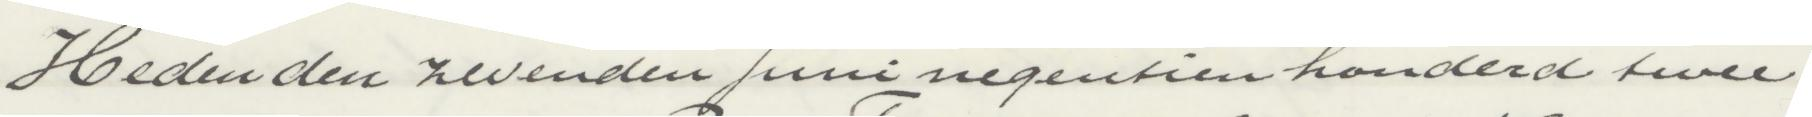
Heden den Zevenden Juni negentien honderd twee
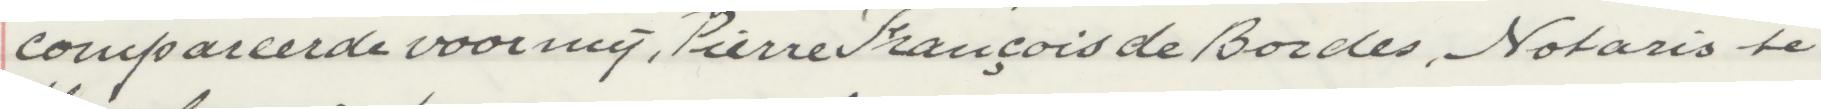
compareerde voor mij, Pierre François de Bordes, Notaris te
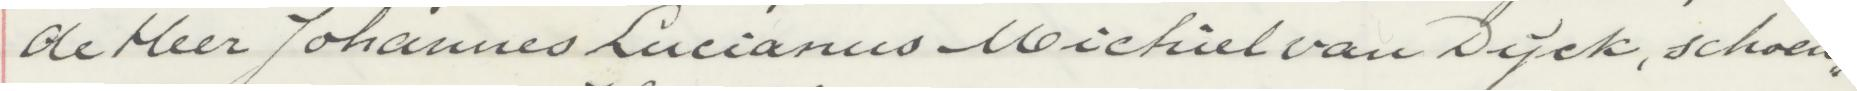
de Heer Johannes Lucianus Michiel van Dijck, schoen„
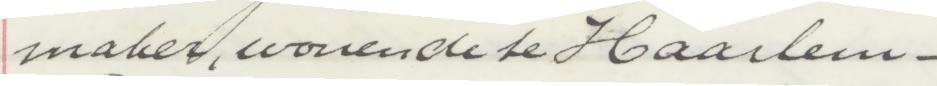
maker, wonende te Haarlem-
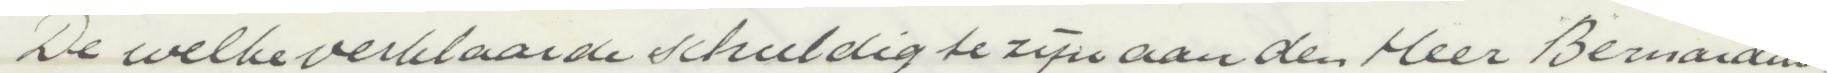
De welke verklaarde schuldig te zijn aan den Heer Bernardus
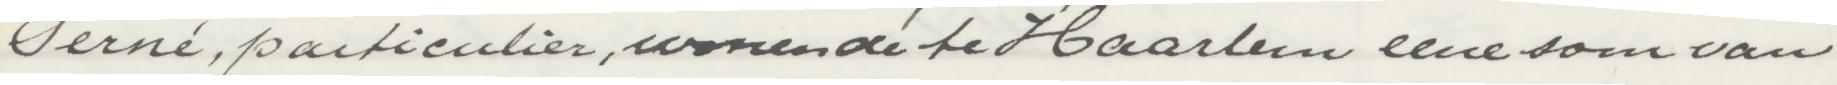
Serné, particulier, wonende te Haarlem eene som van
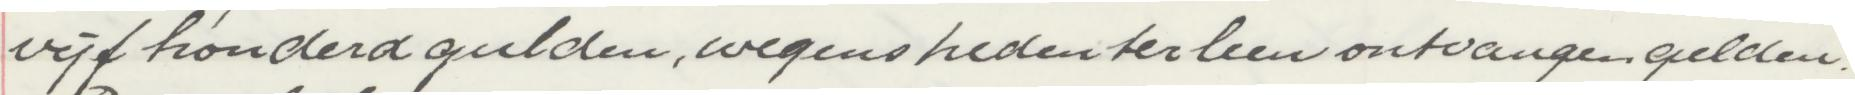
vijf honderd gulden, wegens heden ter leen ontvangen gelden.
